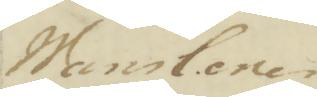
Wansleven
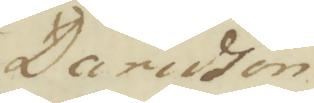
Davidson
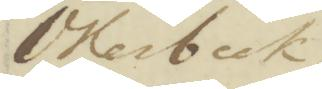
Overbeek
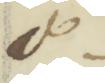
do.
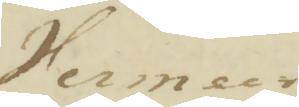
Vermeer
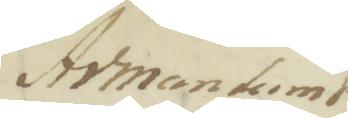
A v mankimt
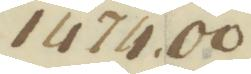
ƒ 1474.00
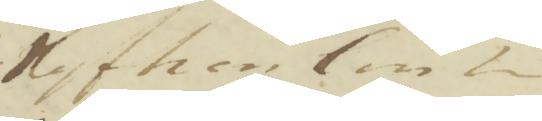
Vyften Cents
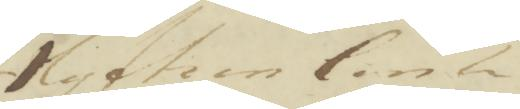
Vjftien Cents
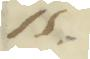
15.-
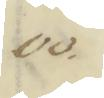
1.00.
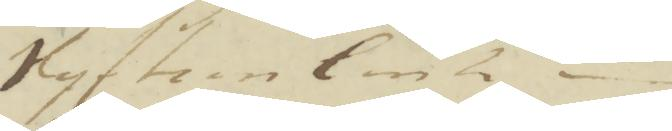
Vyftien Cents —
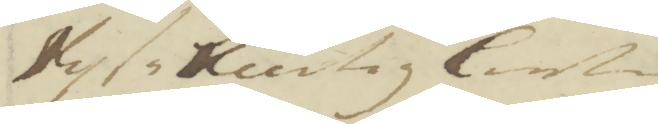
Vyf en Veertig Cents
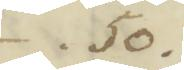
— . 50.
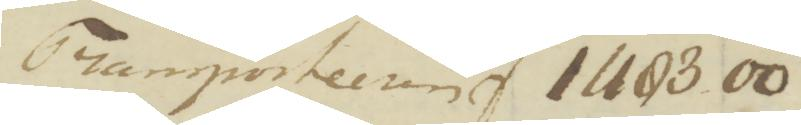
Transporteeren ƒ 1483. 00
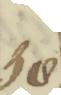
1129. 38
